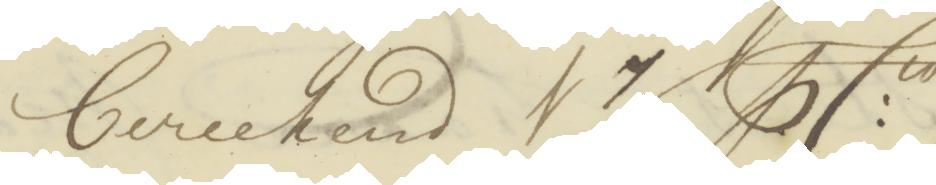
bereekend 1 7/8 pC:to
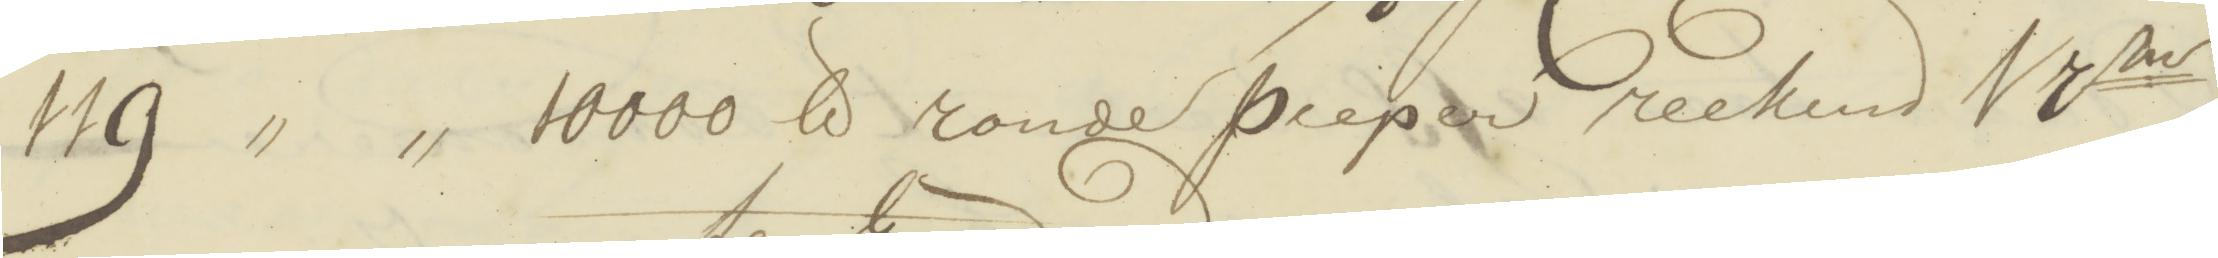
119 „ „ 10000 lb ronde peeper reekend 1 r=m
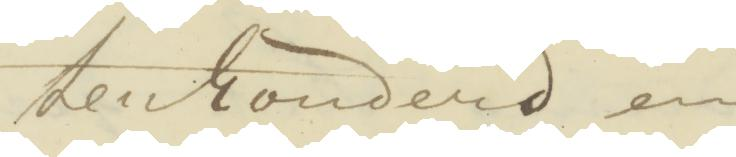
ten honderd en
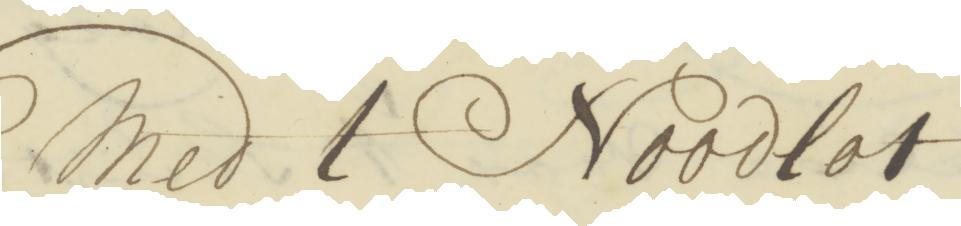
med 't Noodlot
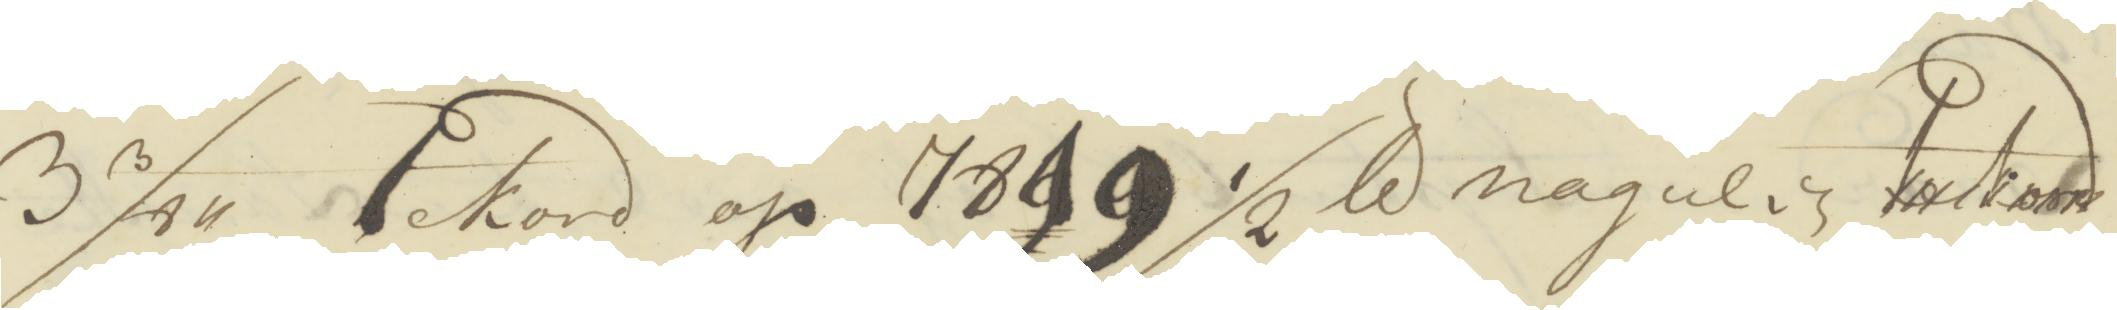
3 3/8 „ tekord op 7849½ lb nagulen tekord
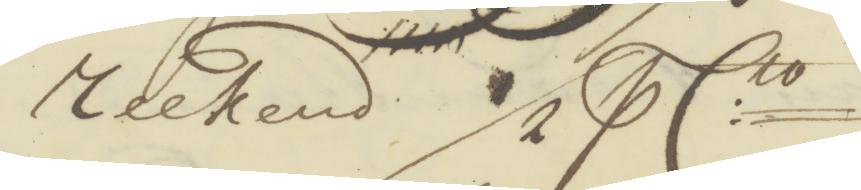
reekend ½ pC:=to
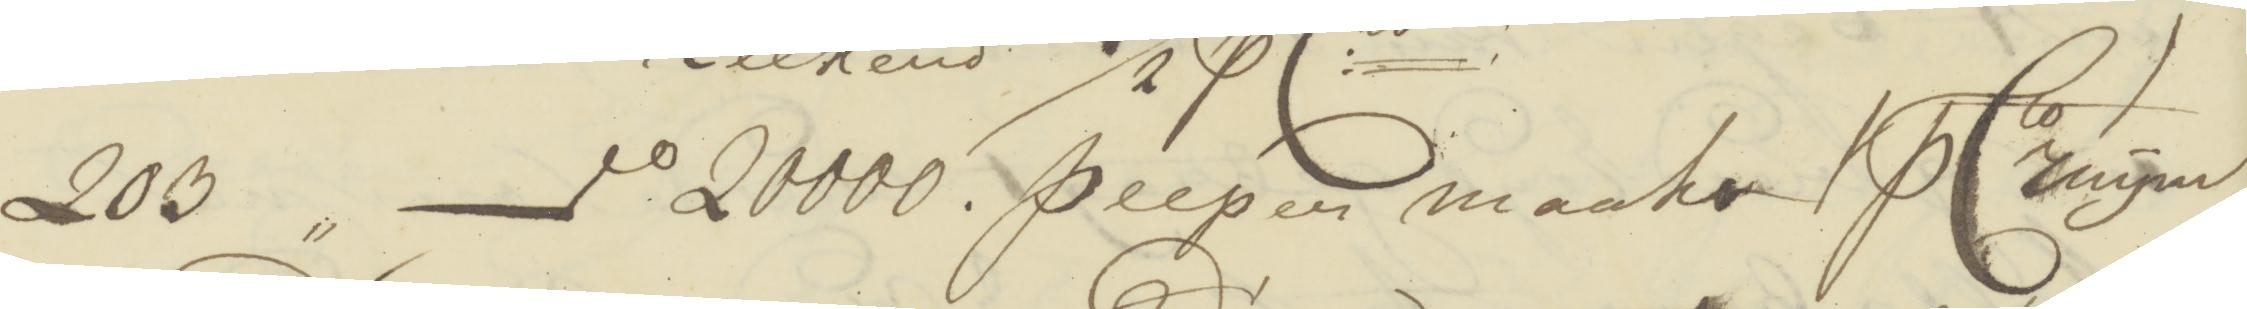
203 „ _o 20000. peeper maakt pCto ruijm
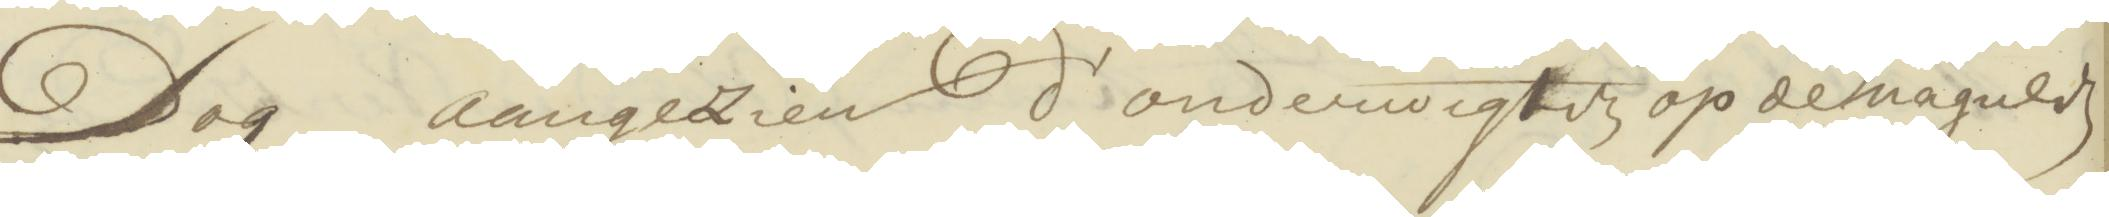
Dog aangezien d'onderwigten op de nagulen
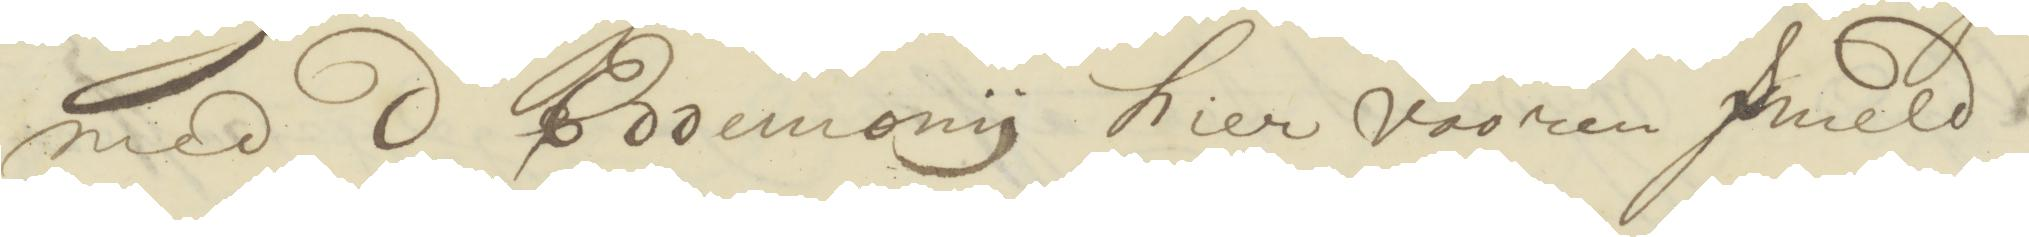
med d'Eddemonij hier vooren vermeld
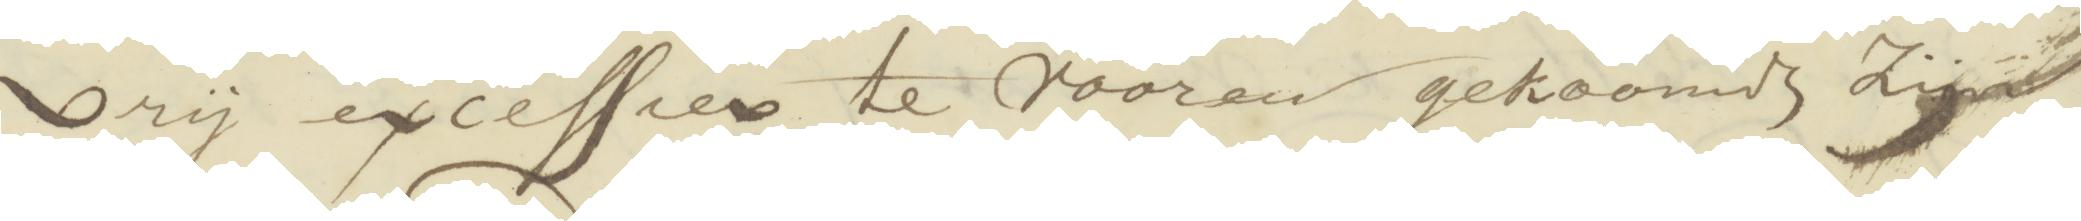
vrij excessiev te vooren gekoomen zijn
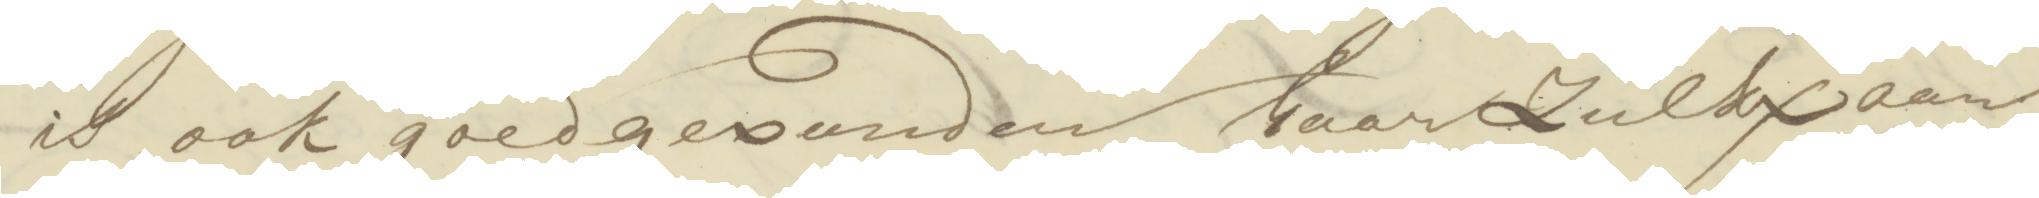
is ook goed gevonden haar zulkx aan
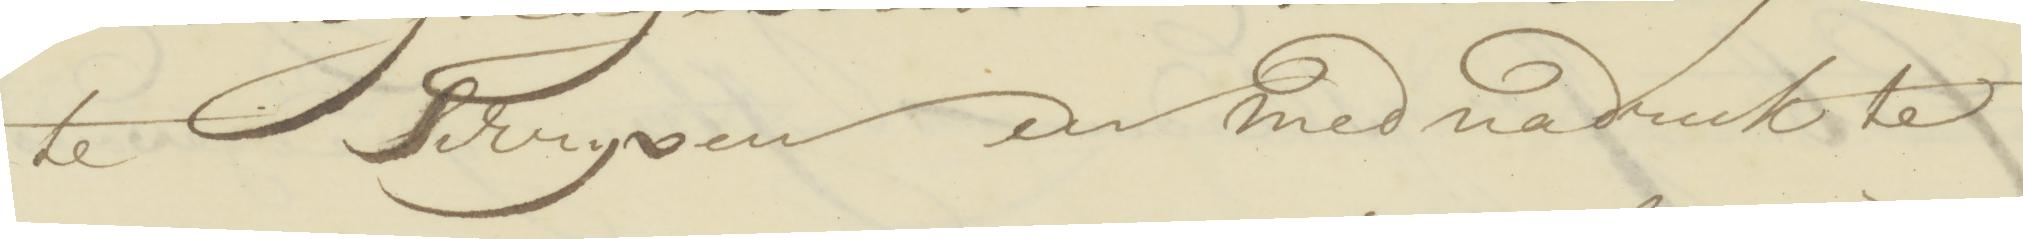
te schryven en med nadruk te
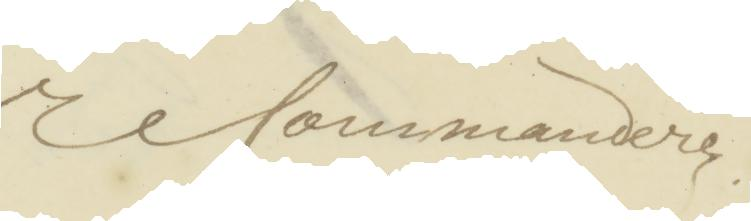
recommanderen
